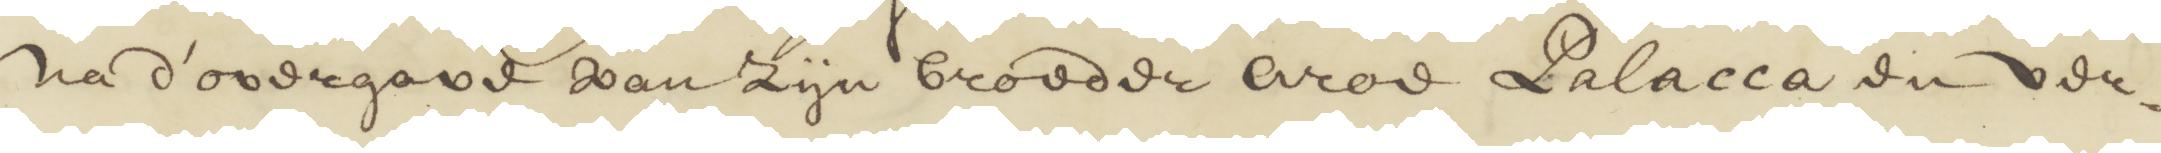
na d’overgave van zijn broeder aroe Palacca en ver=
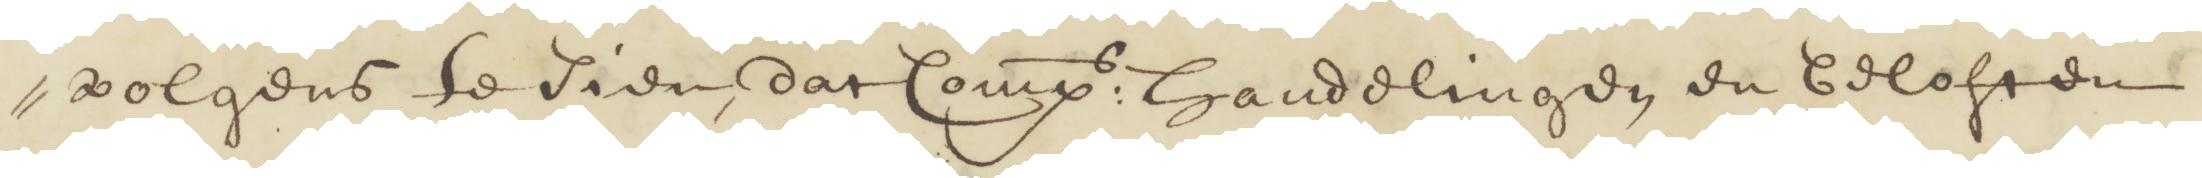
„volgens te sien, dat Comp:s handelingen en beloften
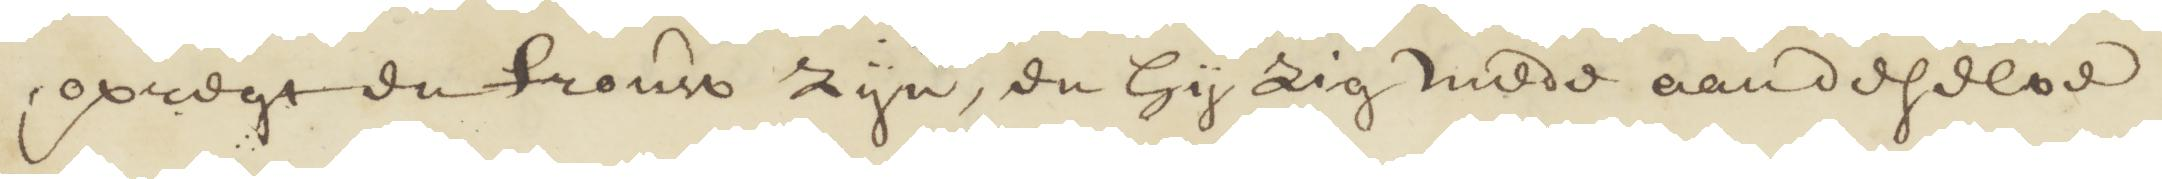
opregt en trouw zijn, en hij zig mede aan deselve
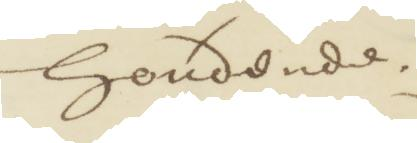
Houdende.
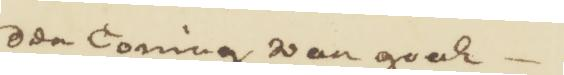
den Coning van goah —
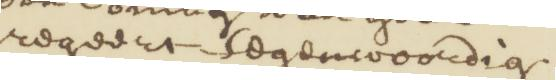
regeert tegenwoordig
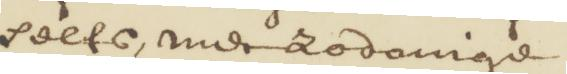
selfs, met zodanige
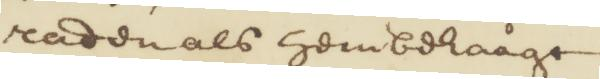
raden als hem behaagt
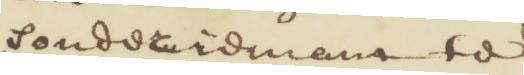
sonder iemant te
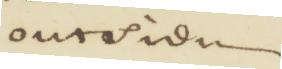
ontsien
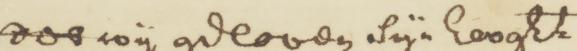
dus wij geloven sijn hoogh=t
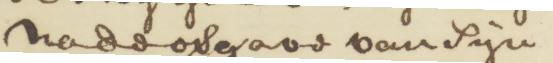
na de overgave van sijn
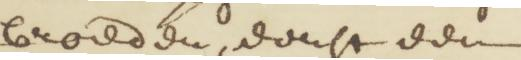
broeder, eerst een
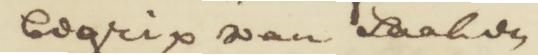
begrip van saaken
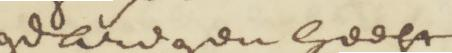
gekregen heeft
